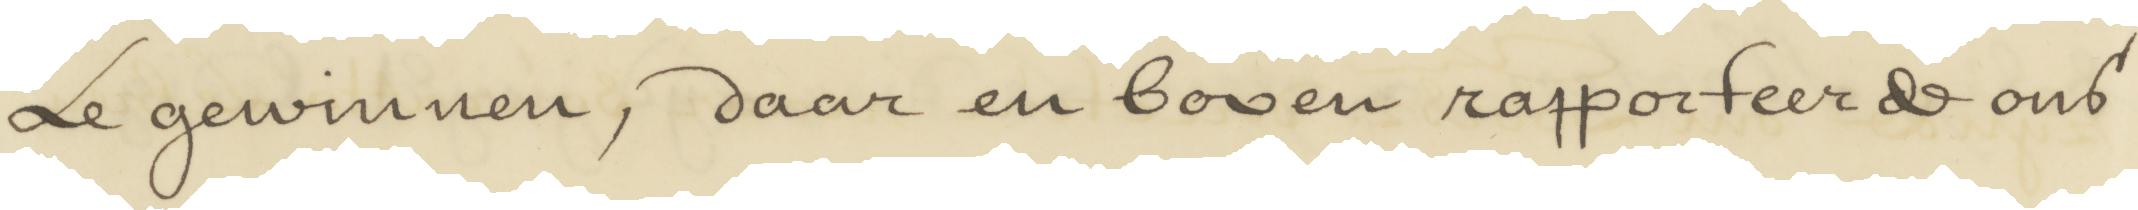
te gewinnen, daar en boven rapporteerde ons
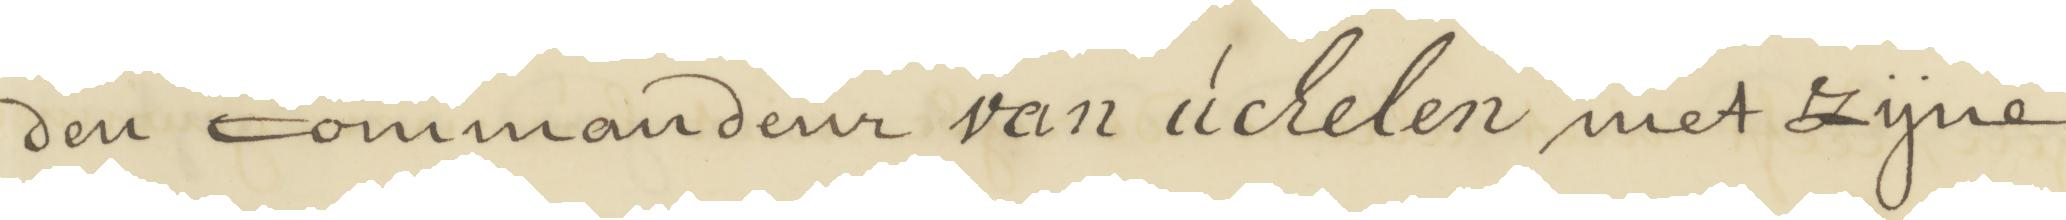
den commandeur van uchelen met zijne
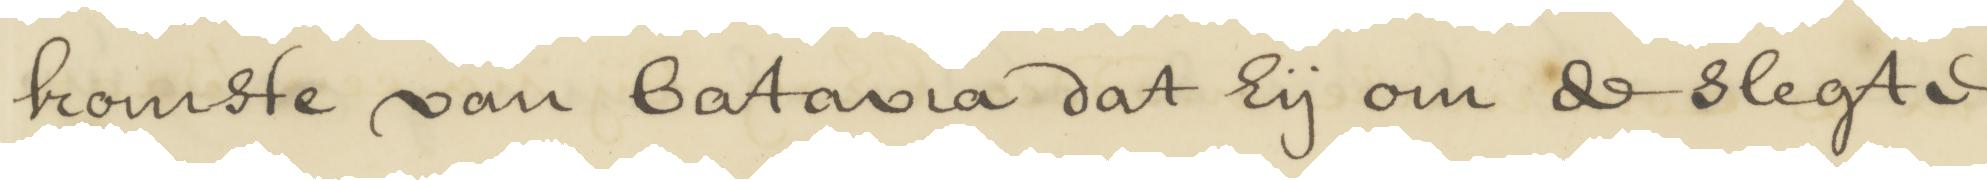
komste van batavia dat hij om de slegte
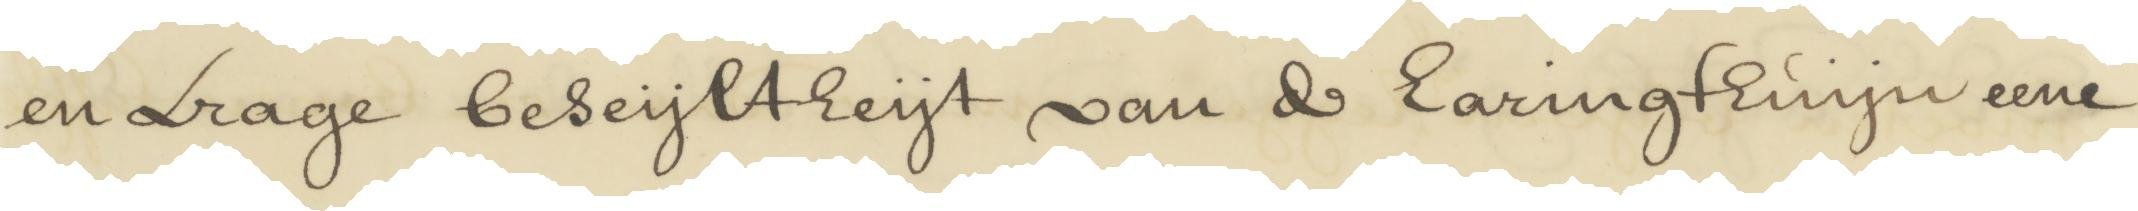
en trage beseijltheijt van de haringthuijn eene
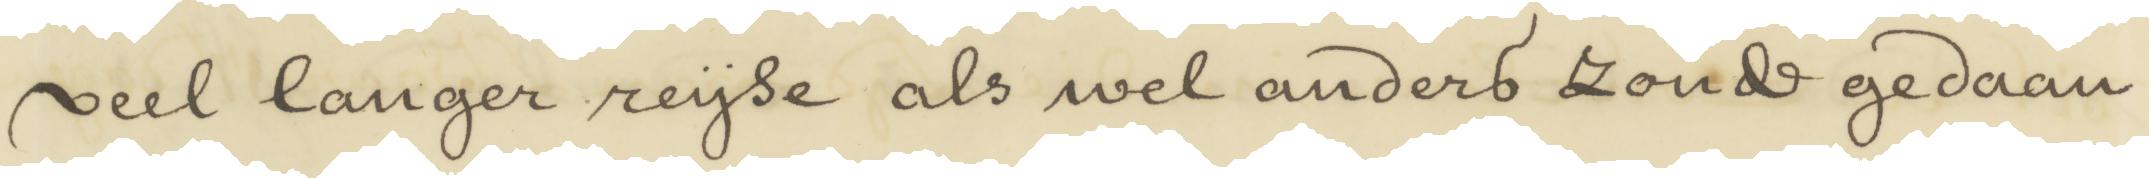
veel langer reijse als wel anders zoude gedaan
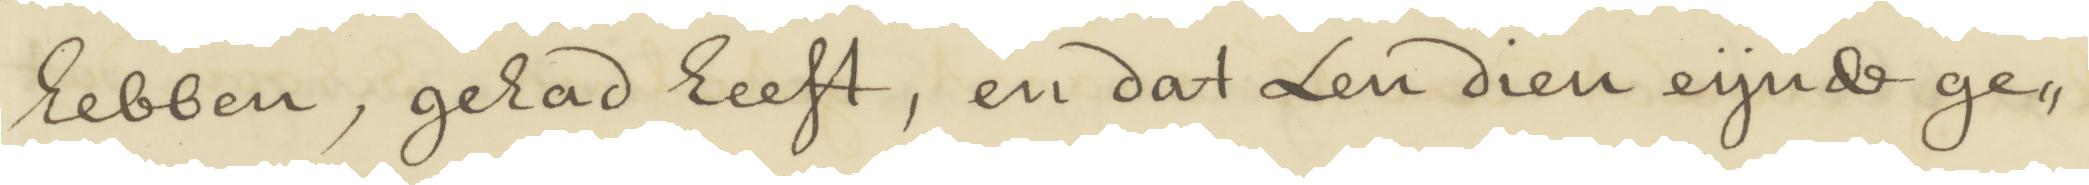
hebben, gehad heeft, en dat ten dien eijnde ge„
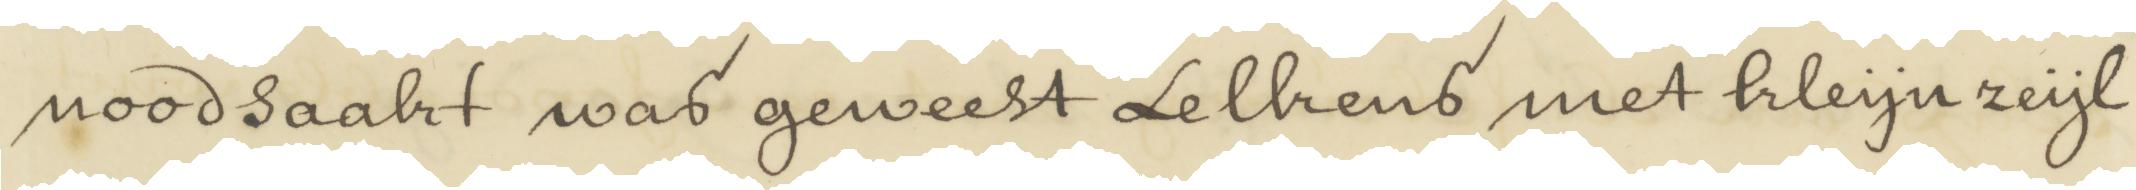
noodsaakt was geweest telkens met kleijn zeijl
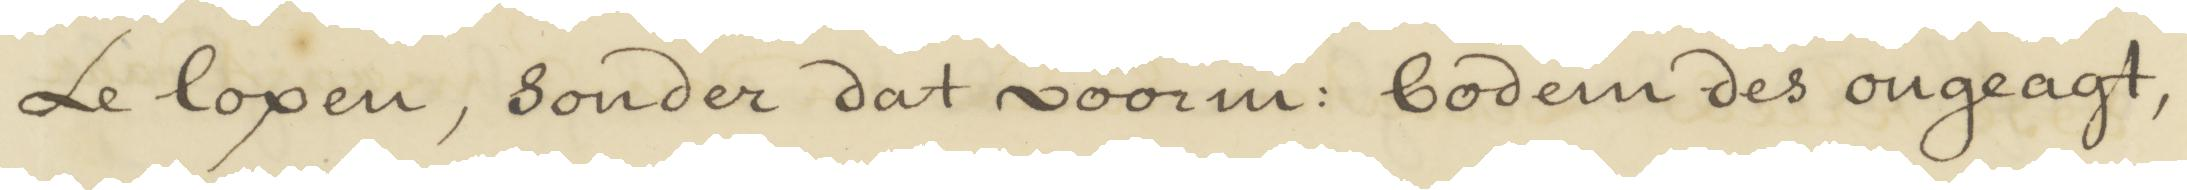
te lopen, sonder dat voorm: bodem des ongeagt,
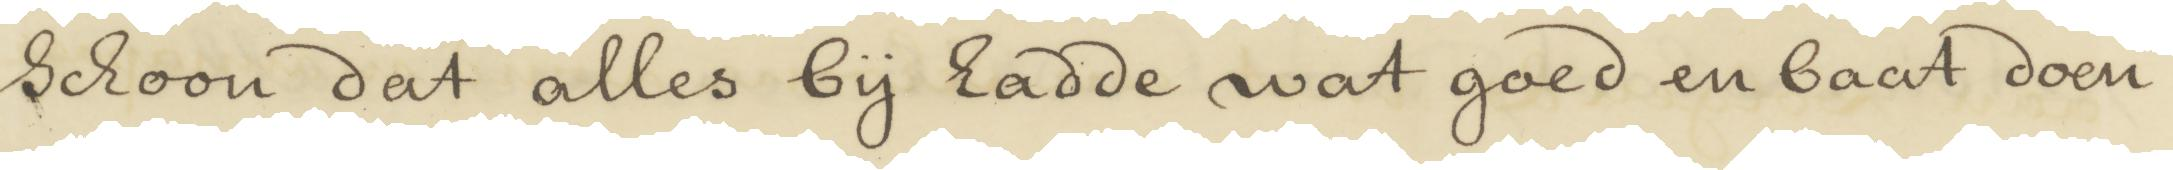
schoon dat alles bij hadde wat goed en baat doen
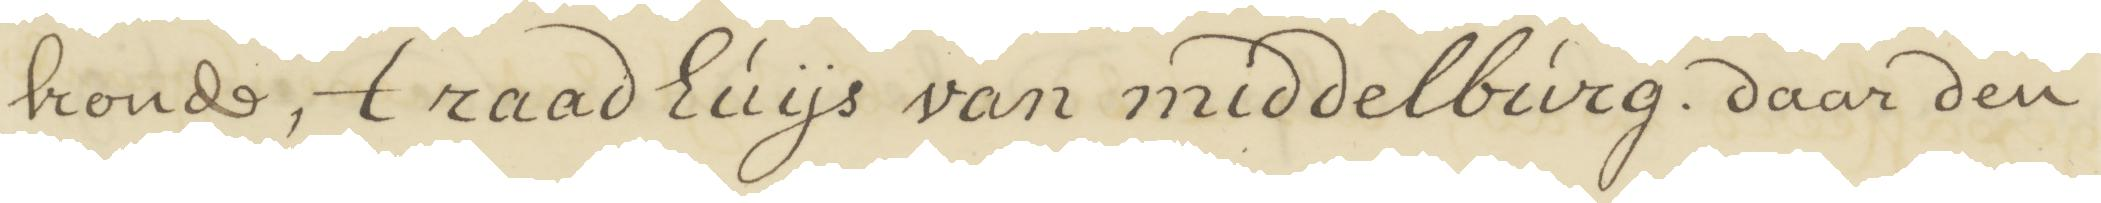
konde, 't raadhuijs van middelburg. daar den
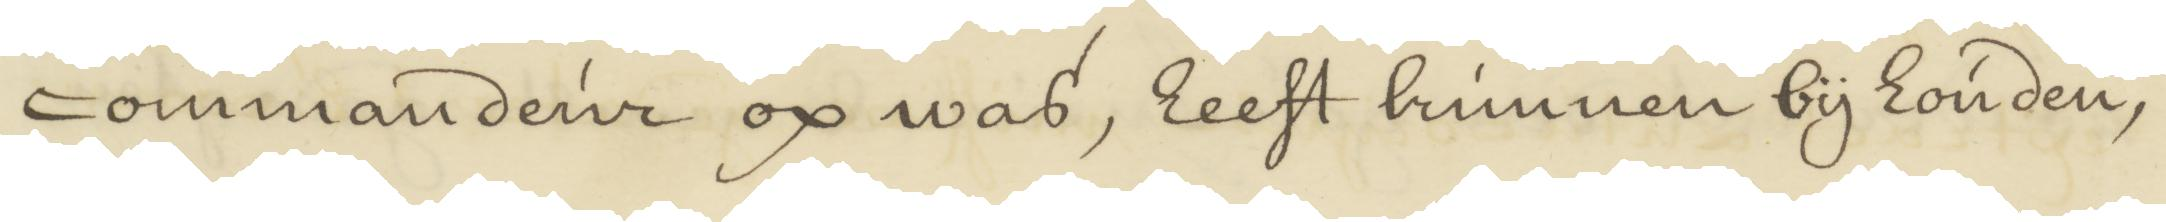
commandeur op was, heeft kunnen bij houden,
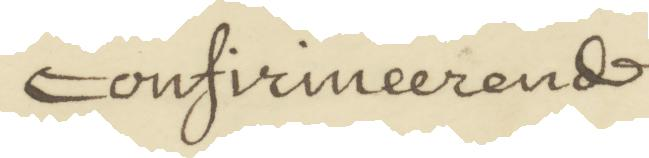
confirmeerende
